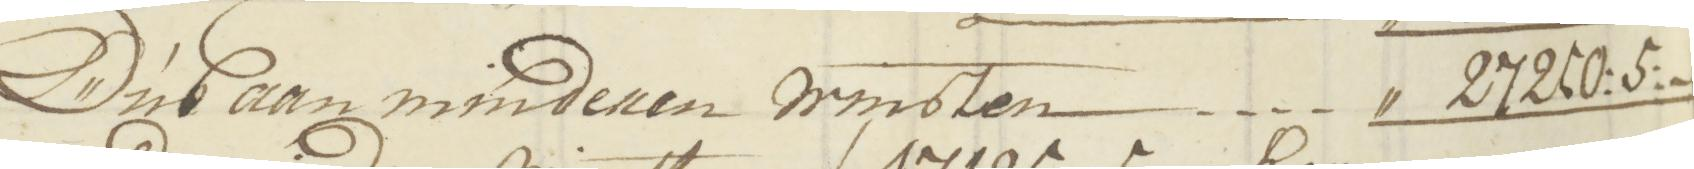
Dus aan minderen winsten „ 27250:5:-
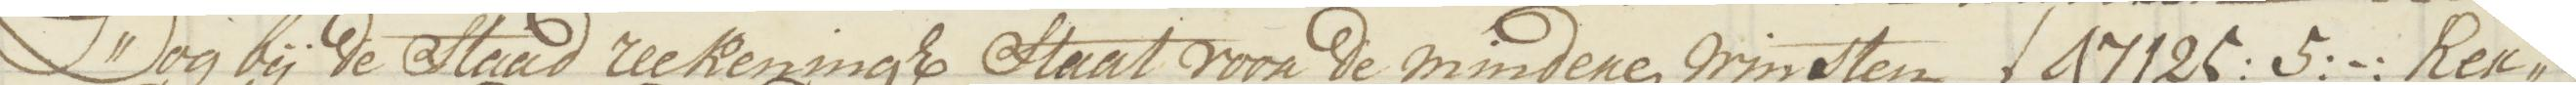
Dog bij de staad reekeningh staat voor de minderen winsten ƒ 47125: 5:–: her„
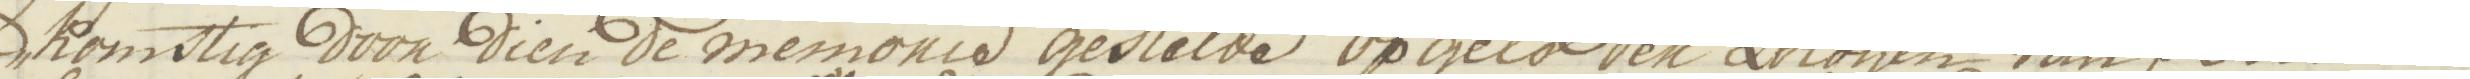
„komstig door dien de memorie gestelde opgeld der zoldijen van ƒ80000:—:
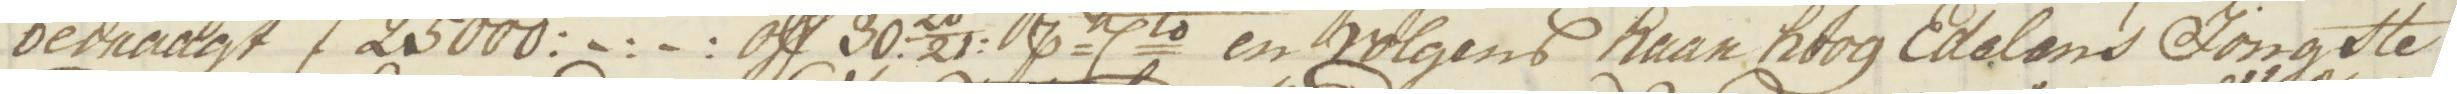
bedraagt ƒ25000:-:-: off 30: 20/21: p=r C=to en volgens haar hoog Edelens Iongste
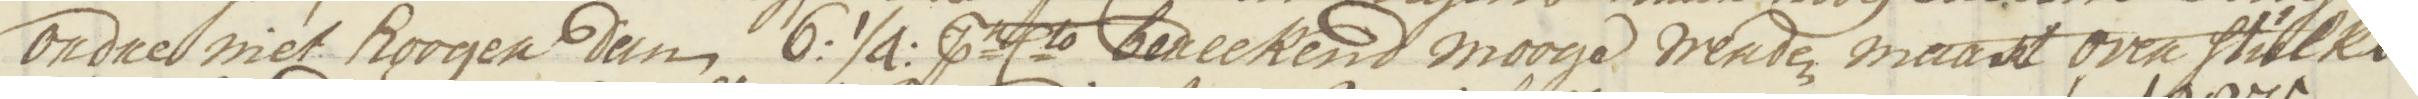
ordre niet hooger dan 6: ¼: p=r C=to bereekend mooge werden maakt over stulks
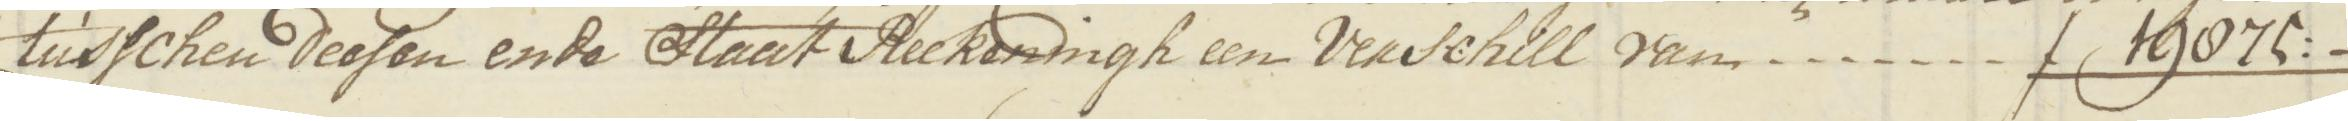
tusschen deesen ende staat Reekeningh een verschill van - - - - - - - ƒ19875:
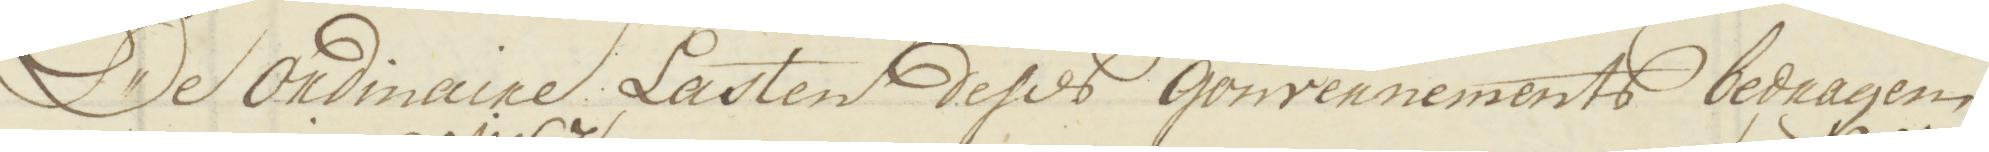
De ordinaire: Lasten deses gouvernements bedragen
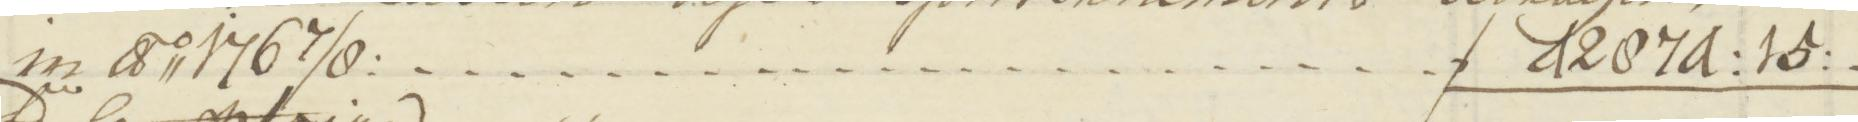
in A„o 176 7/8: - - - - - - - - - - - - - - - . . - - - - ƒ 42874:15:
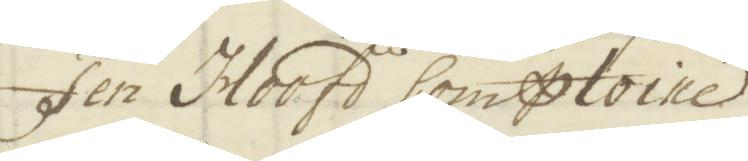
Ten Hoofd Comptoire
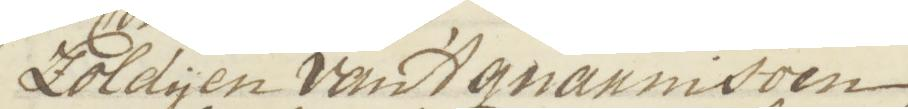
zoldijen van 't guarnisoen
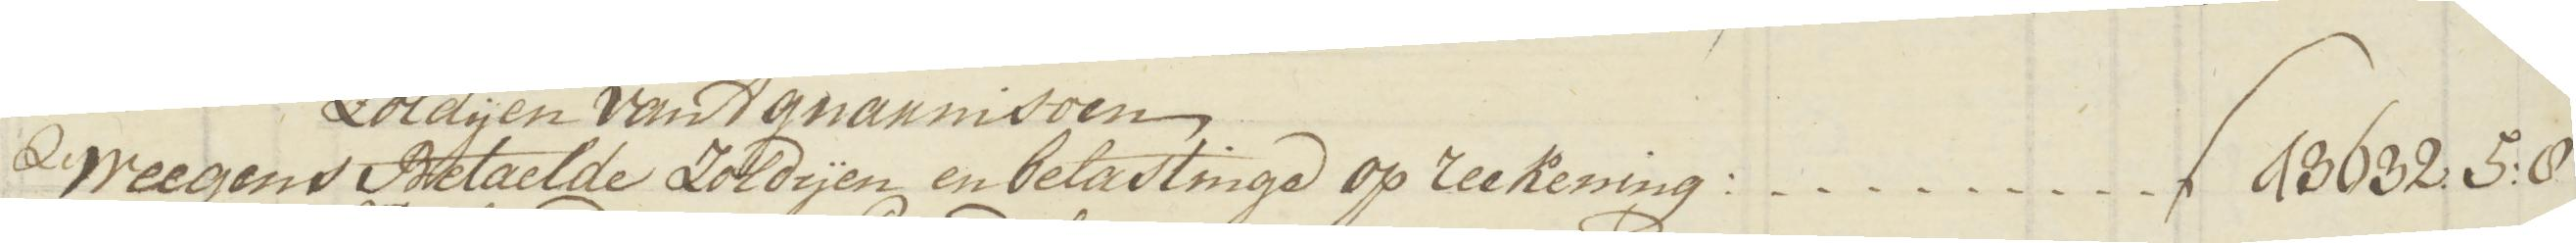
weegens Betaelde zoldijen en belastinge op reekening: - - - - - - - - - ƒ43632. 5:8
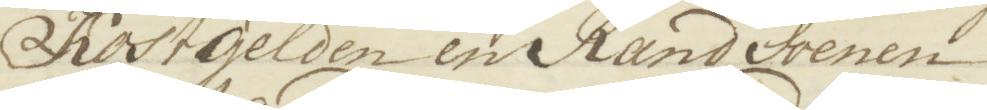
Kostgelden en Randsoenen
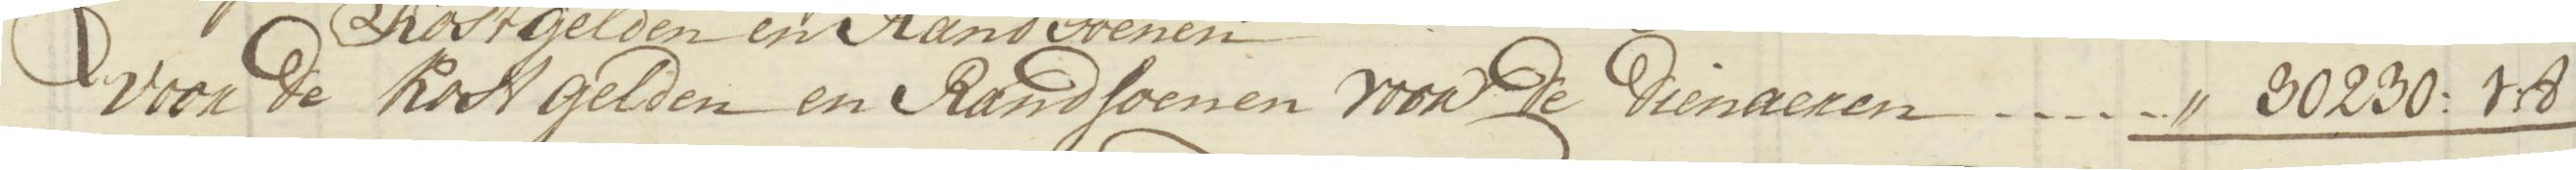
voor de kost gelden en Randsoenen voor de dienaeren - - - - -. „ 30230: 1:8
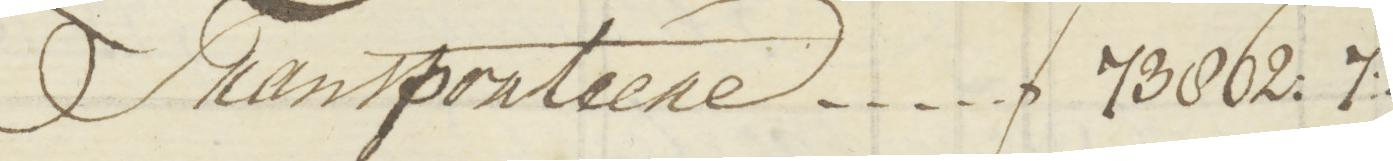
Transporteere - - - - . ƒ 73862: 7:
